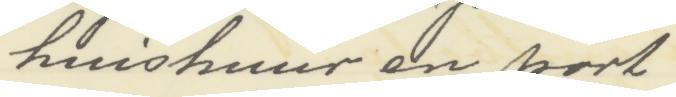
huishuur en port
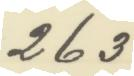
263
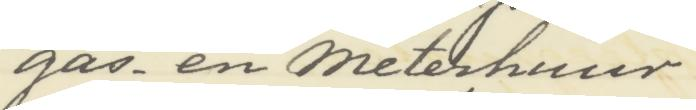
gas- en meterhuur
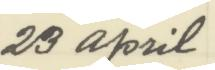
23 april
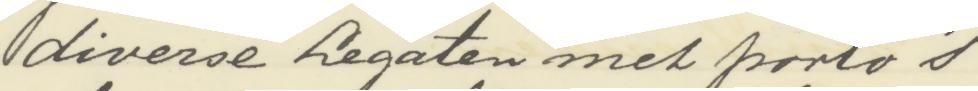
diverse legaten met porto 's
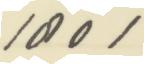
1801
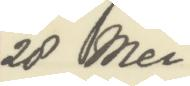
28 Mei
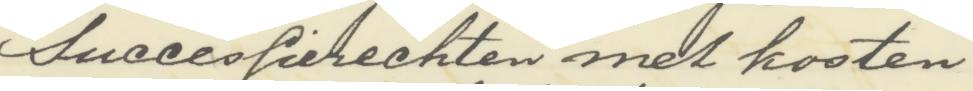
Successierechten met kosten
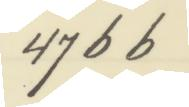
4766
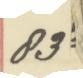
83:
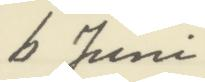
6 Juni
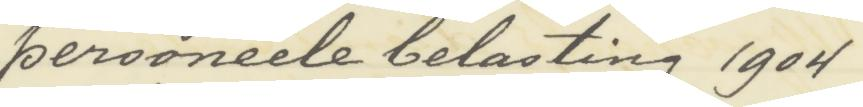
personeele belasting 1904
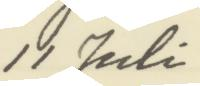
11 Juli
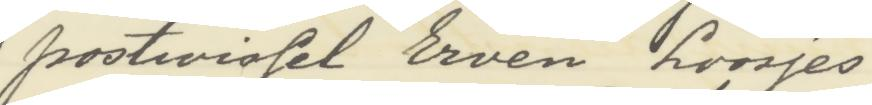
postwissel Erven Loosjes
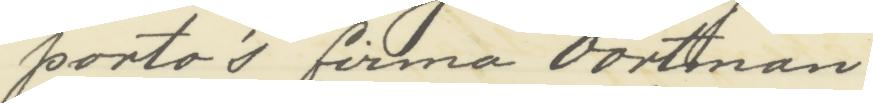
porto 's firma Oortman
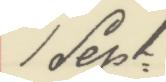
1 Sep=t
